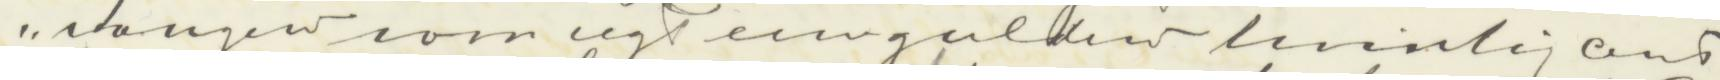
„vangen voor regt een gulden twintig cent
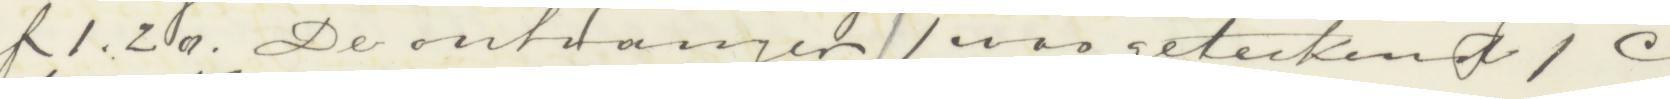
ƒ1.20. De ontvanger /was geteekend/ C
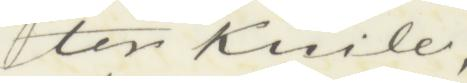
ter Kuile,
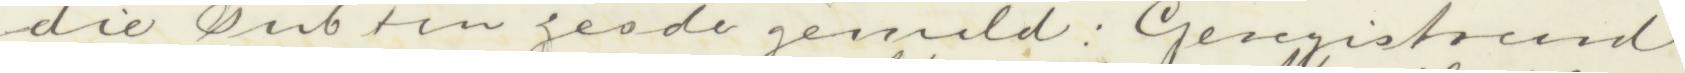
die sub ten zesde gemeld: Geregistreerd
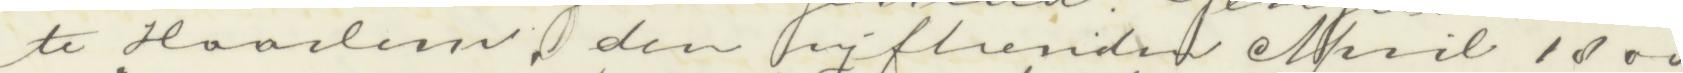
te Haarlem, den vyftienden April 1800
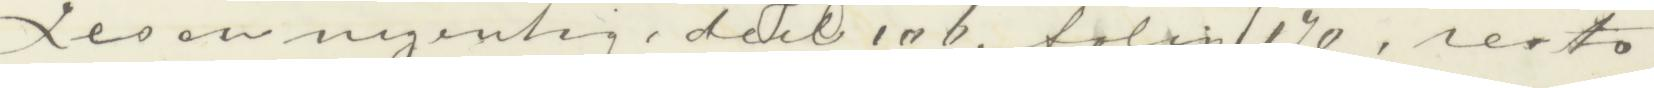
Zes en negentig, deel 106, folio 170, recto
